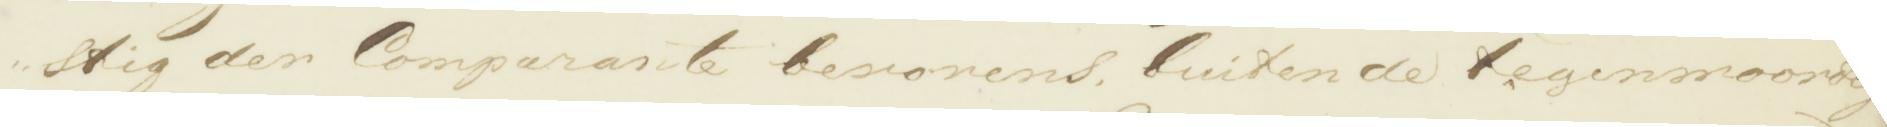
„stig der Comparante bevorens, buiten de tegenwoordig
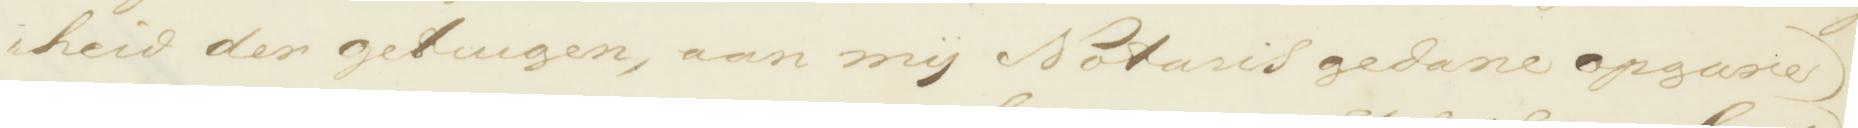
heid der getuigen, aan mij Notaris gedane opgave)
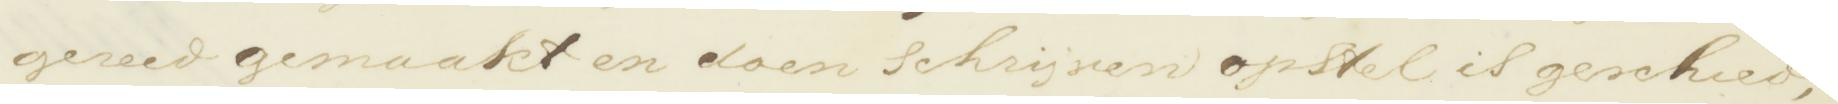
gereed gemaakt en doen schrijven opstel is geschied,
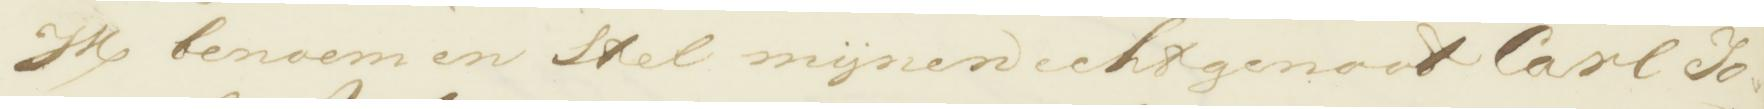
Ik benoem en stel mijnen echtgenoot Carl Io,
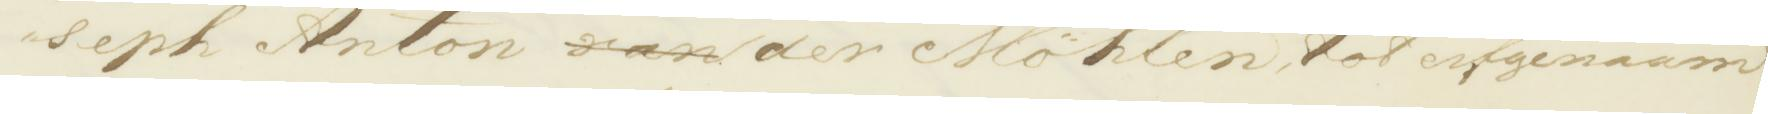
„seph Anton van der Möhlen, tot erfgenaam
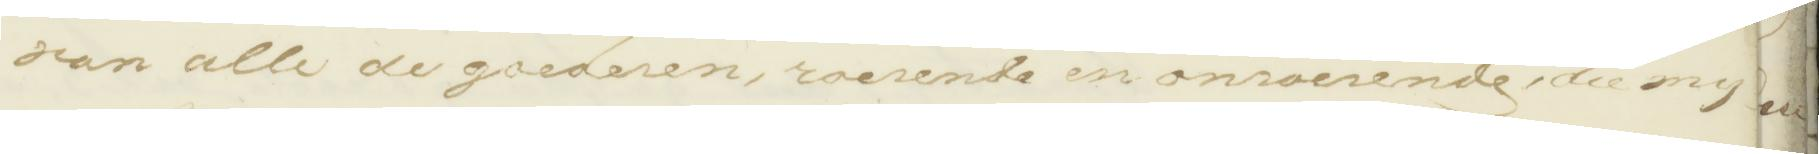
van alle de goederen, roerende en onroerende, die my
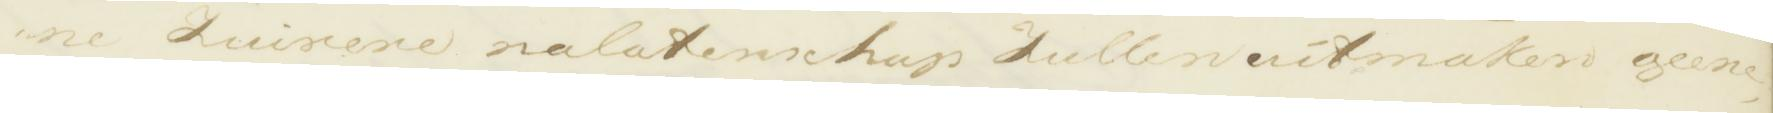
„ne Zuivere nalatenschap Zullen uitmaken geene
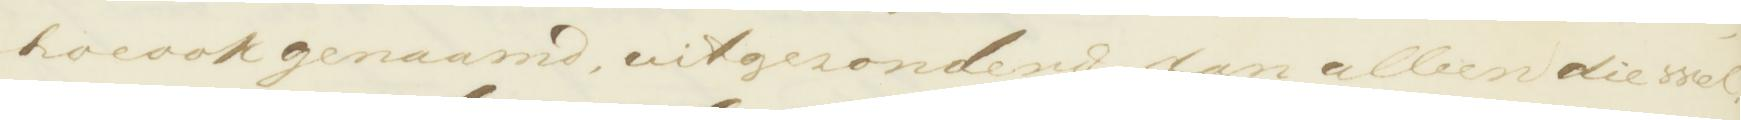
hoe ook genaamd, uitgezonderd dan alleen die wel,
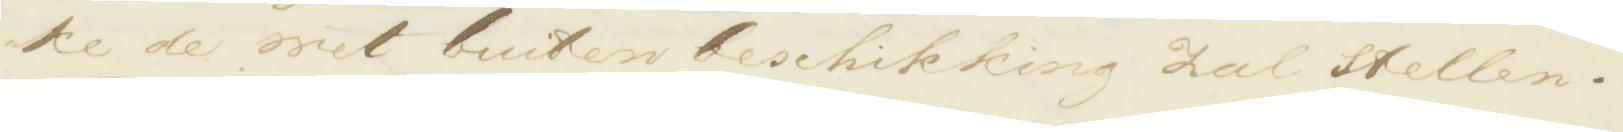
„ke de wet buiten beschikking Zal stellen.
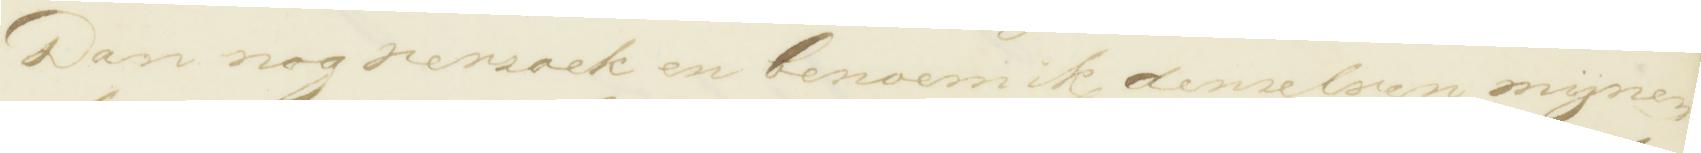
Dan nog verzoek en benoem ik denzelven mijnen
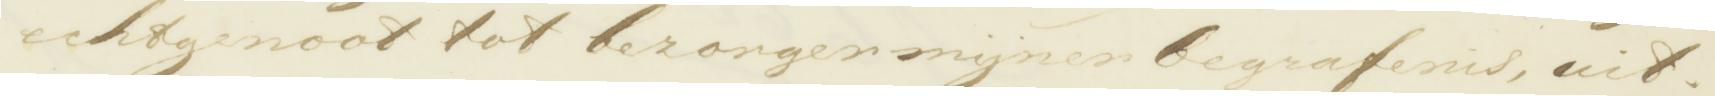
echtgenoot tot bezorger mijner begrafenis, uit„
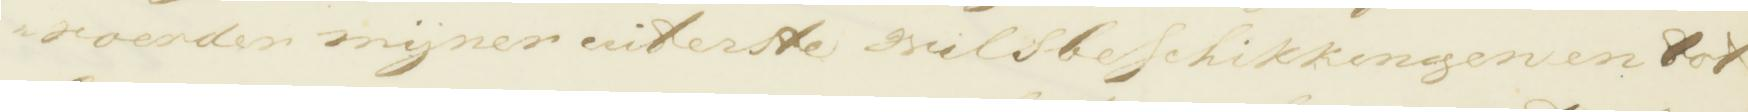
„voerden mijner uiterste wilsbeschikkingen en tot
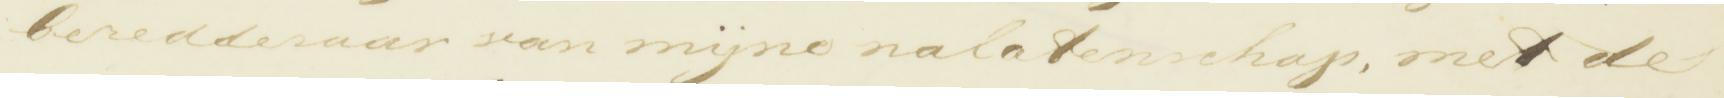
beredderaar van mijne nalatenschap, met de
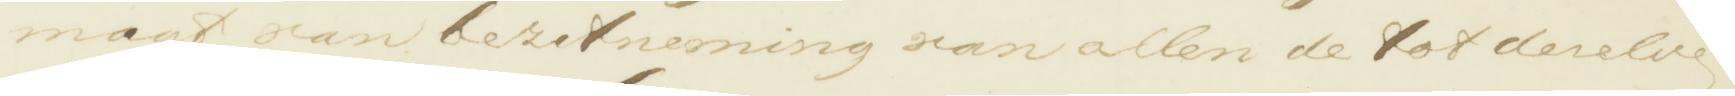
magt van bezitneming van allen de tot dezelve
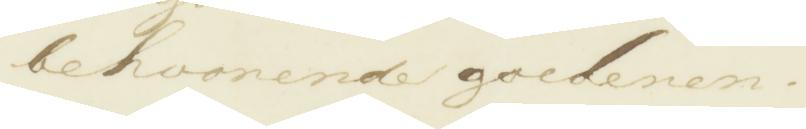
behoorende goederen.
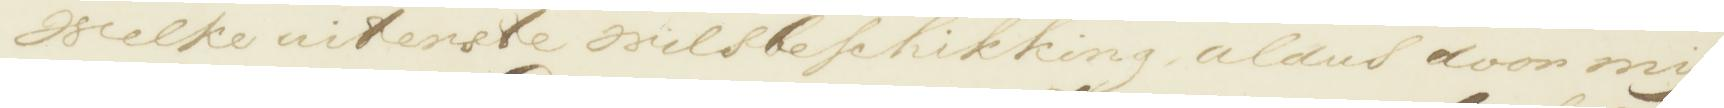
welke uiterste wilsbeschikking, aldus door mij
